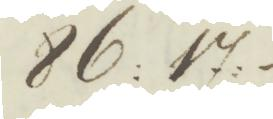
86: 17: —
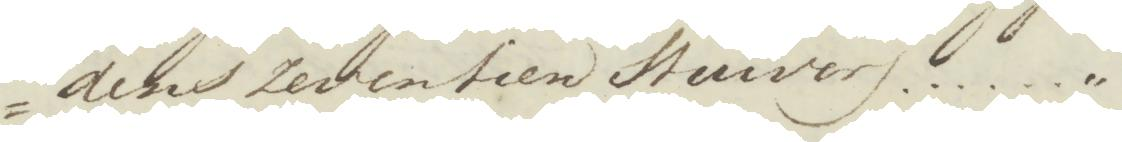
„dens zeventien stuivers . . . . . . „
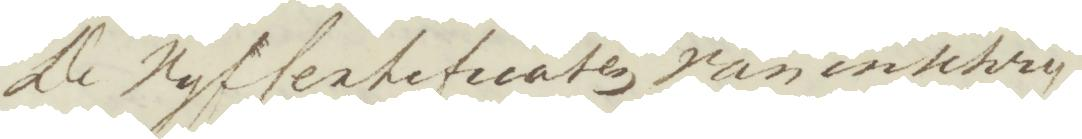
De Vijf Certificaten van inschry:
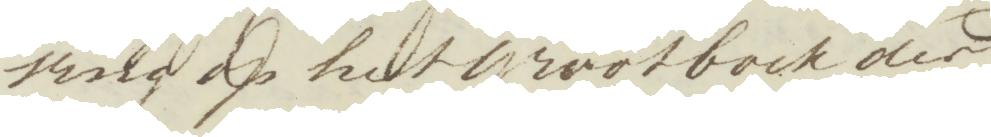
ving op het Grootboek der
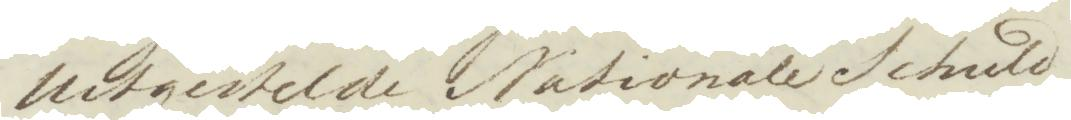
Uitgestelde Nationale Schuld
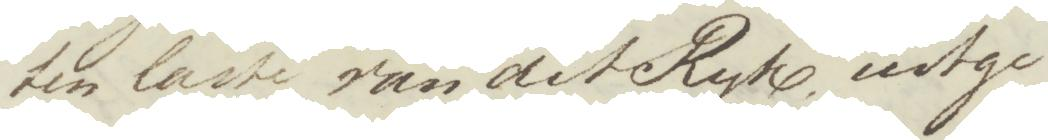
ten laste van dit Ryk, uitge
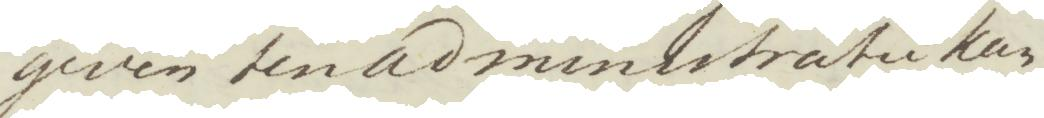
geven ten administratie kan
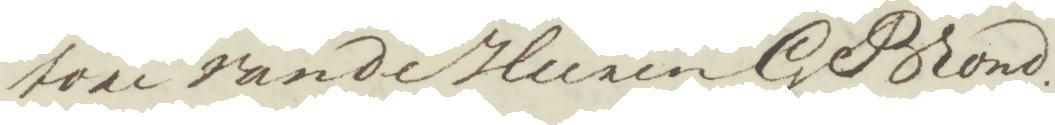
tore van de Heeren G Brond.
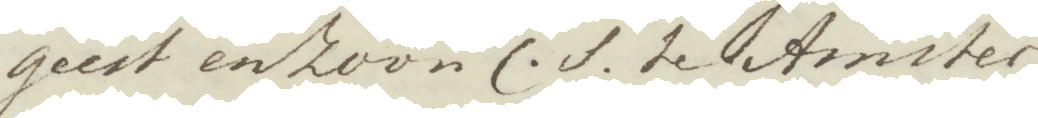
geest en Zoon C.s. te Amster
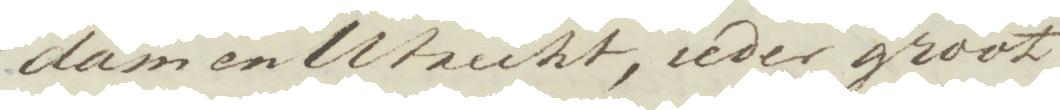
„dam en Utrecht, ieder groot
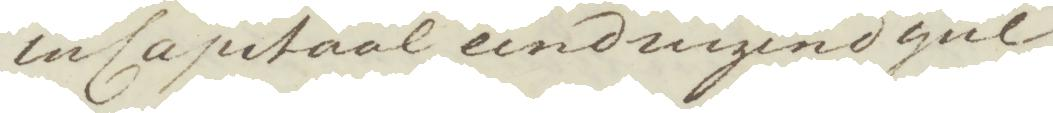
in Capitaal eenduizend gul:
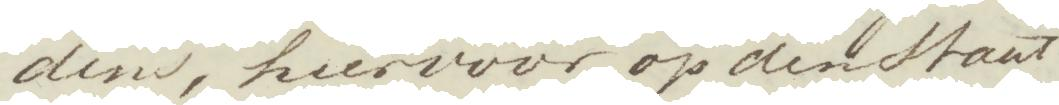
dens, hiervoor op den staat
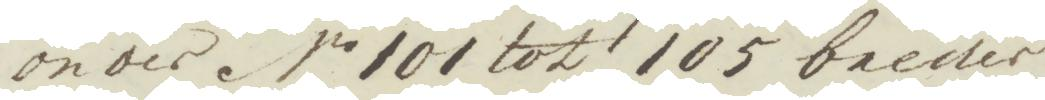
onder N:o 101 tot 105 breder
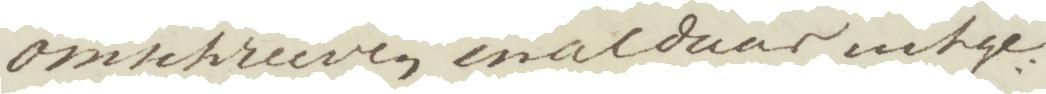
omschreeven en aldaar uitge„
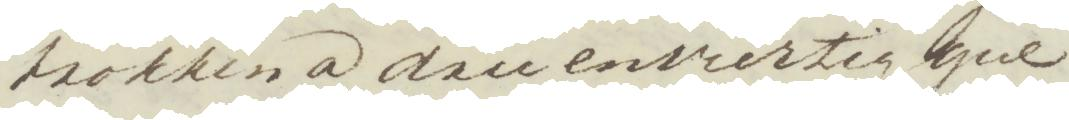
trokken a drie enveertig gul
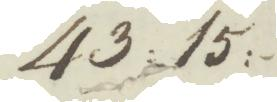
43: 15:-
